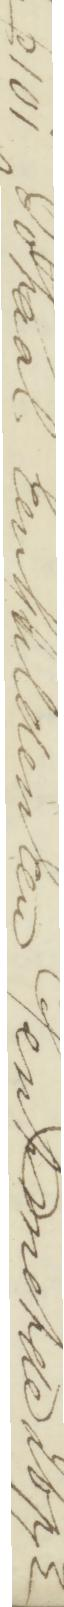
ƒ 101 Totaal Een Gulden Een Cent met de 26 pCt=
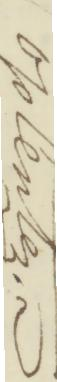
opcenten. —
